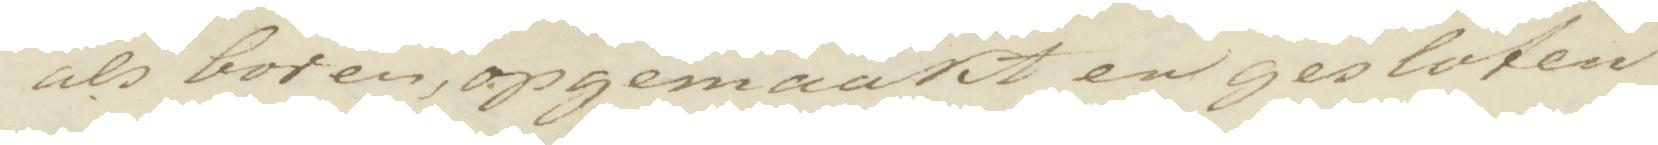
als boven, opgemaakt en gesloten
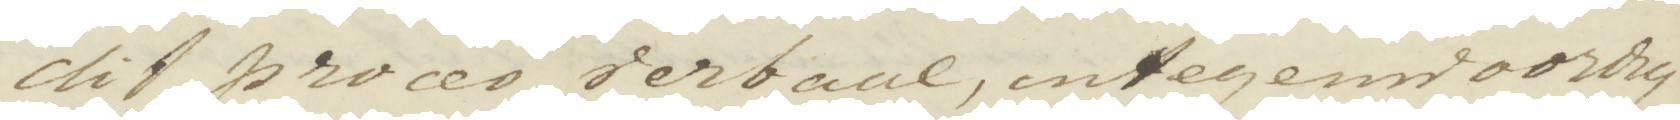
dit proces verbaal, integenwoordig
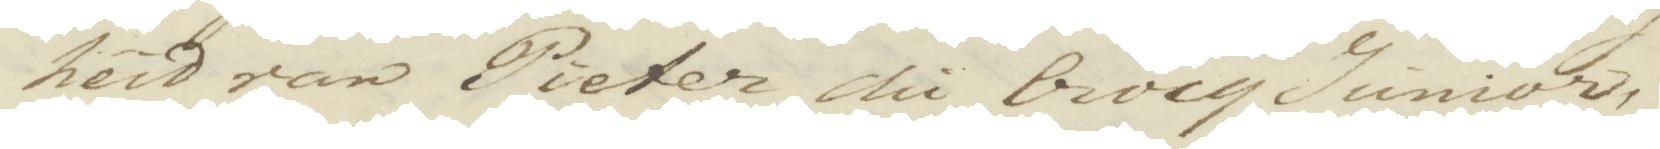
heid van Pieter du Crocq Iunior,
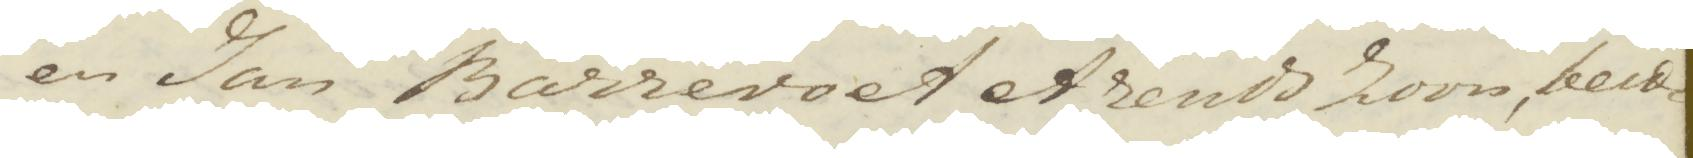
en Ian Barrevoet Arends Zoon, beide
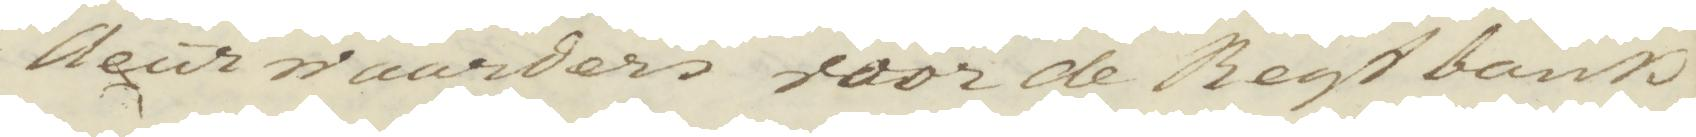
deur waarders voor de Regtbank
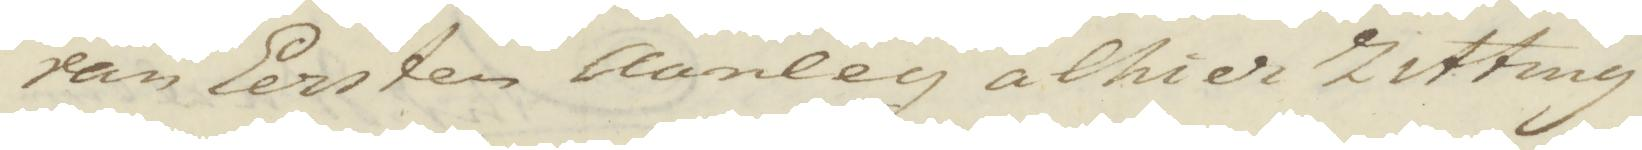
van Eersten Aanleg alhier Zitting
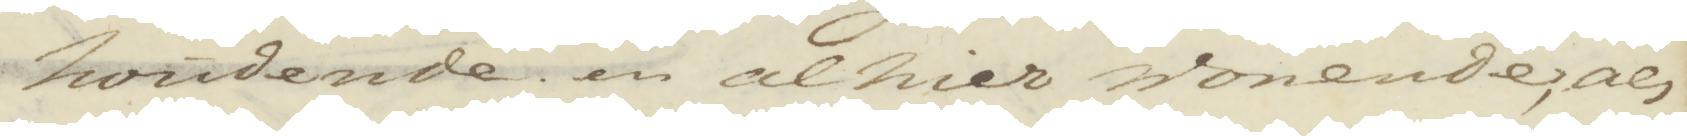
houdende en alhier wonende, als
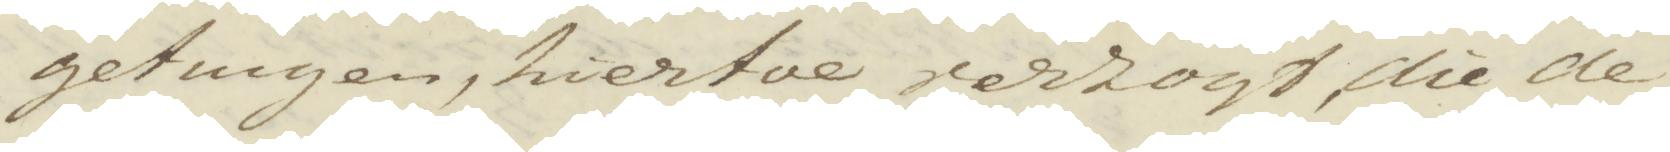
getuigen, hiertoe verzogt, die de
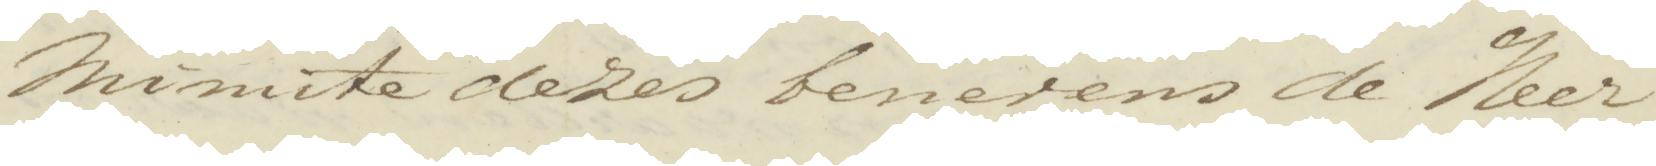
minute dezes benevens de Heer
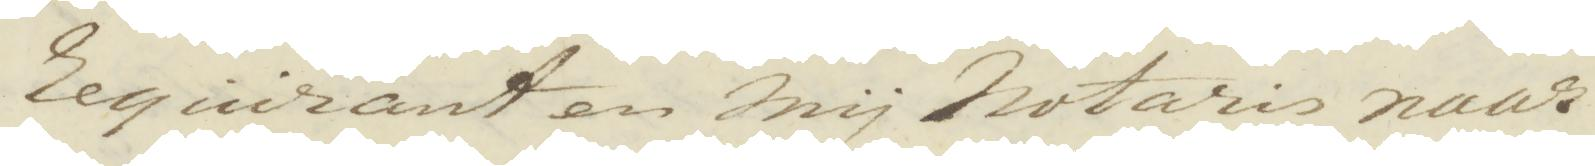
requirant en mij notaris naar
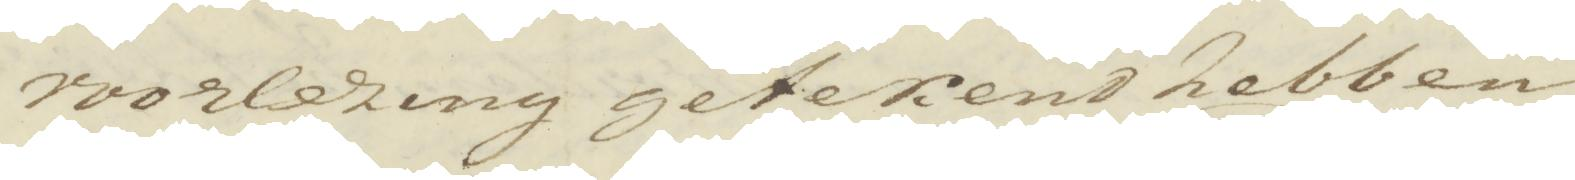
voorlezing getekend hebben.
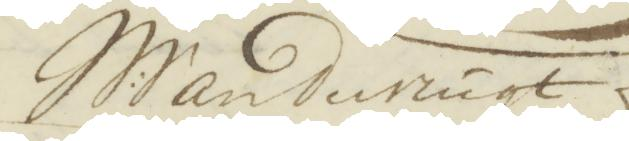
WW:Vandervrugt
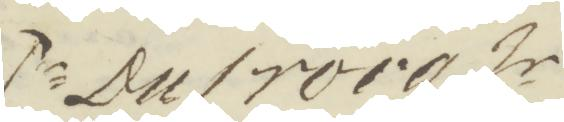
V: DuCrocq Jr
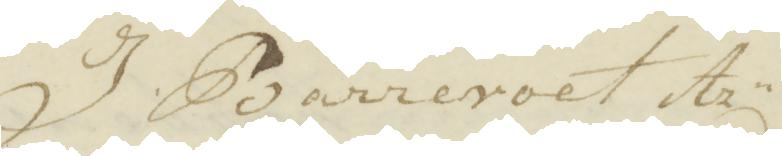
I: Barrevoet Azn
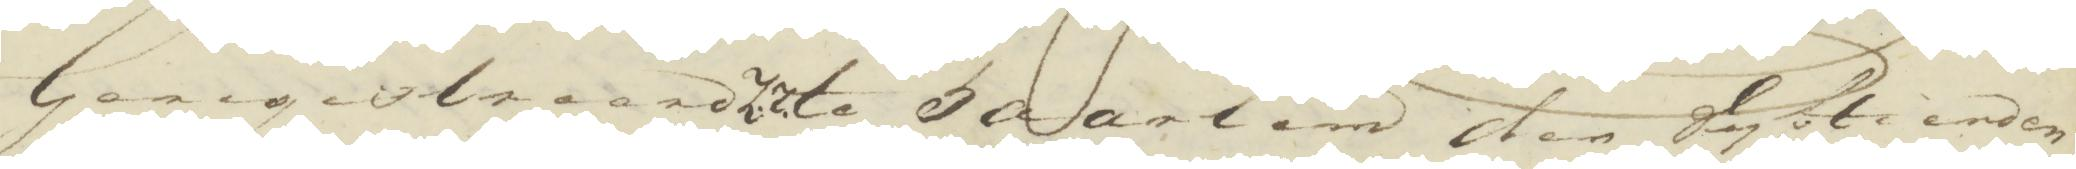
Geregistreerd Z.r. te Haarlem den Vyftienden
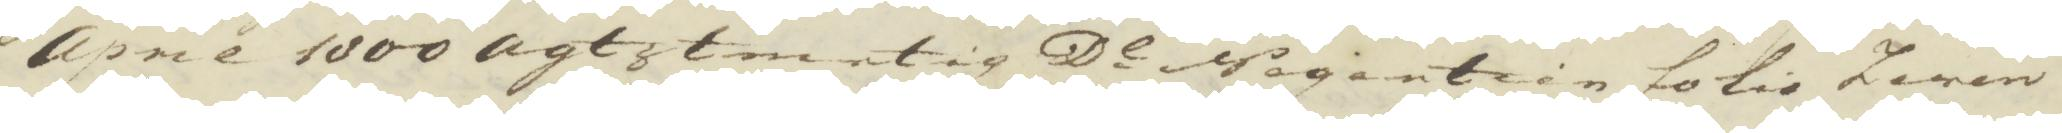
April 1800 agtentwintig D=o Negentien folio Zeven
